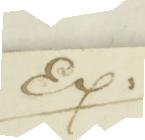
Ex:
